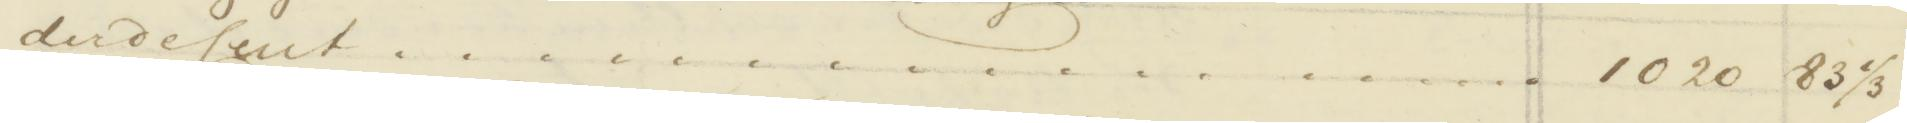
derde Cent . . . . . . . . . . . . . . . . . „ 1020 83 1/3
